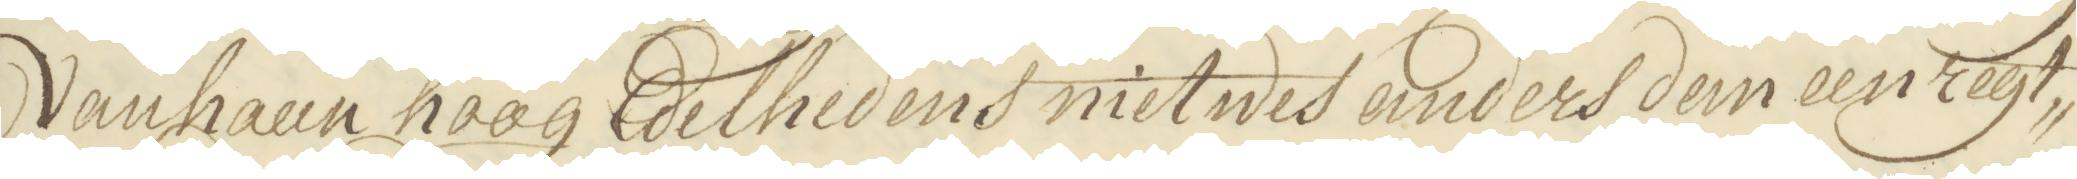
van haar hoog Edelhedens nietwes anders dan een regt„
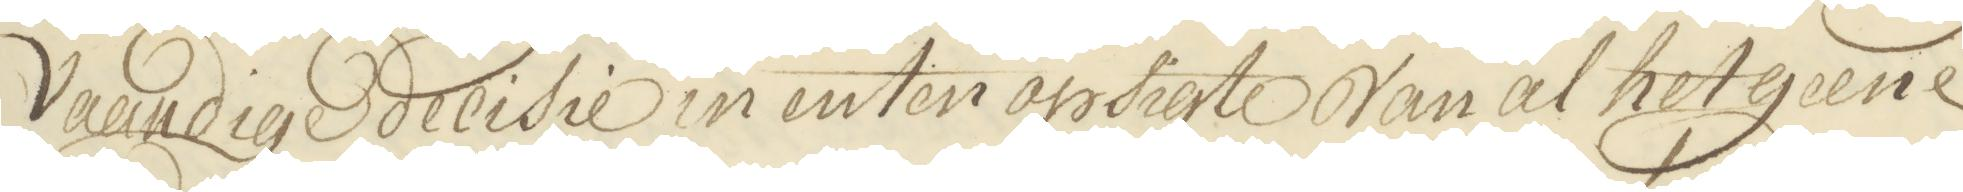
vaardige decisie in en ter opsigte van al hetgeene
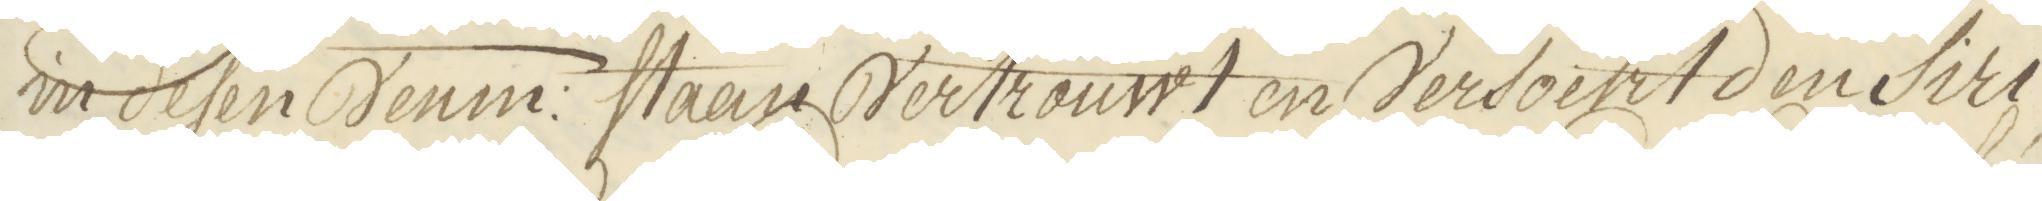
in desen verm: staan vertrouwt en versoekt den siri
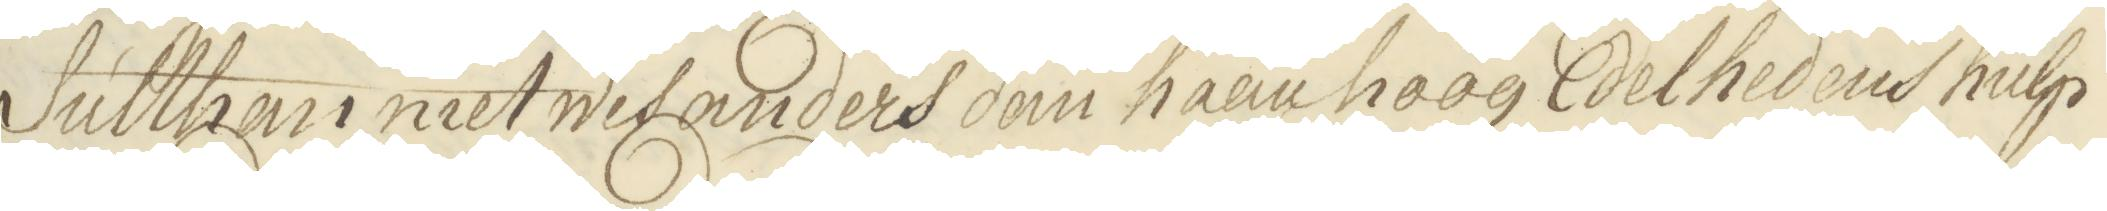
sulthan niet wesanders dan haar hoog Edelhedens hulp
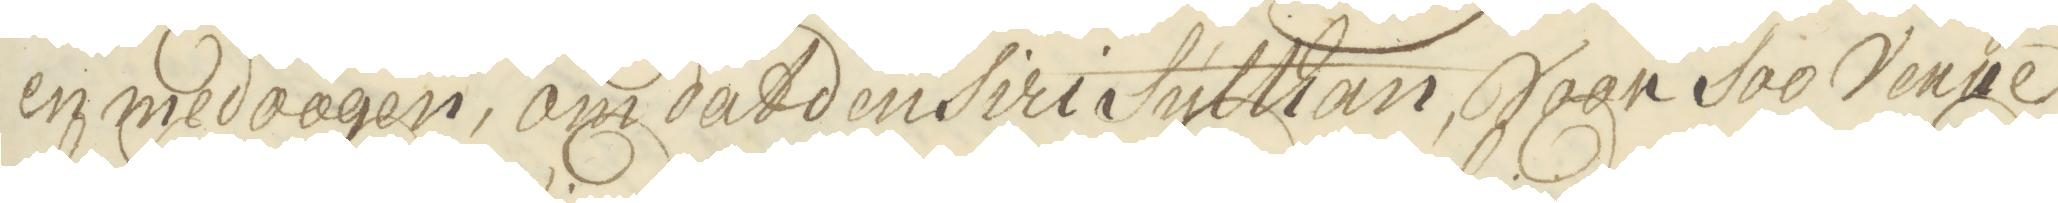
en medoogen, om dat den siri sulthan, voor soo verre
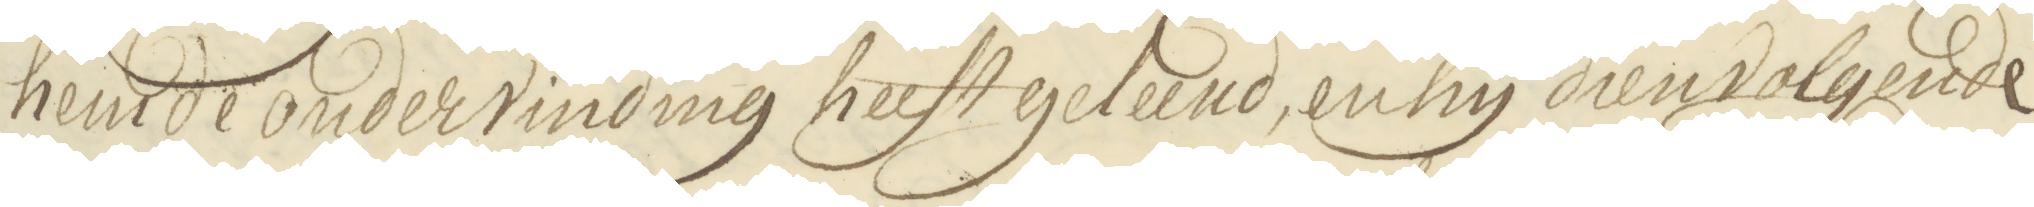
hem de ondervinding heeft geleerd, en hij dienvolgende
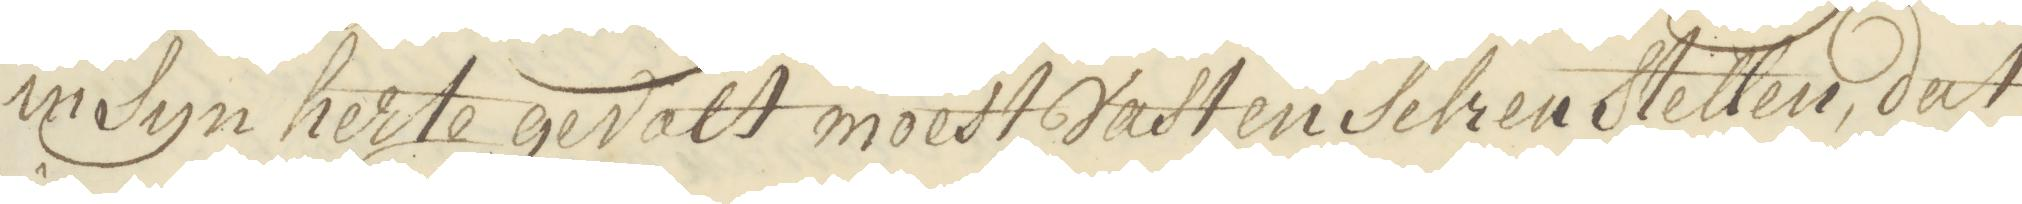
in sijn herte gevalt moest vast en seker stellen, dat
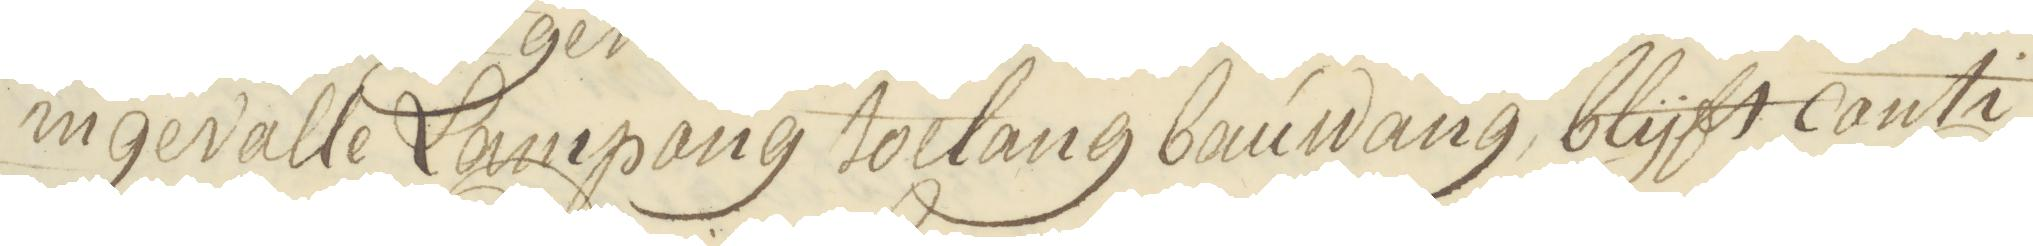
in gevalle Lampong toelang bauwang, blijft conti
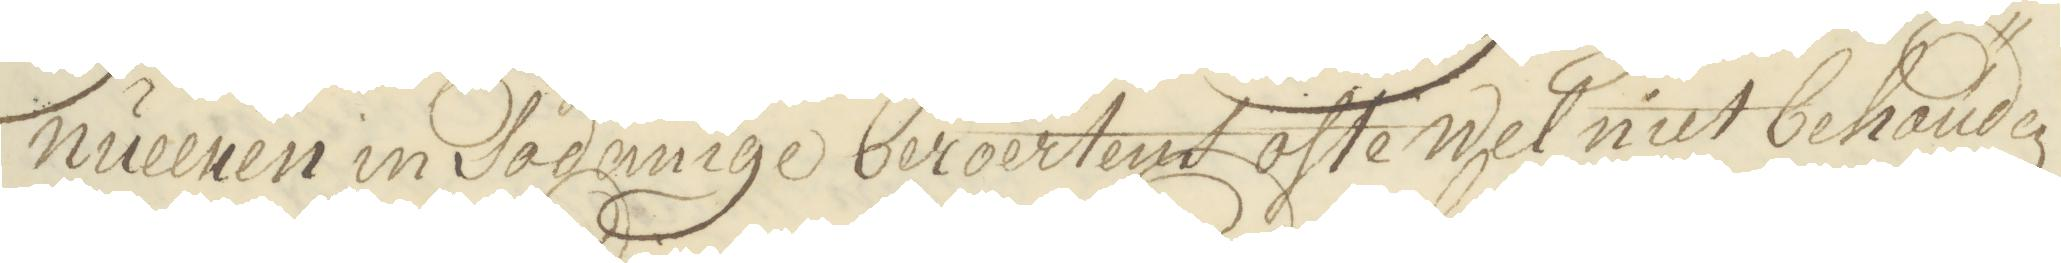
nueeren in sodanige beroertens ofte wel niet behouden
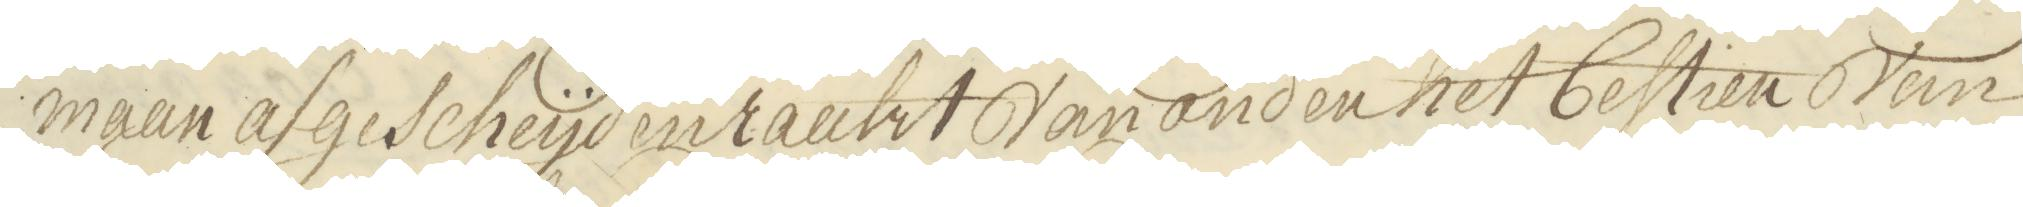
maar afgescheijd en raakt van onder het bestier van
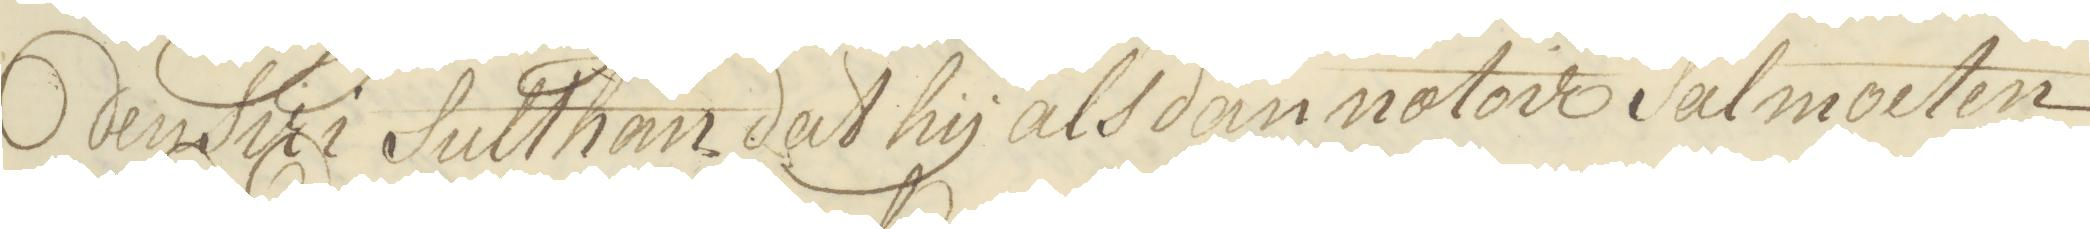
den siri sulthan dat hij als dan notoir sal moeten
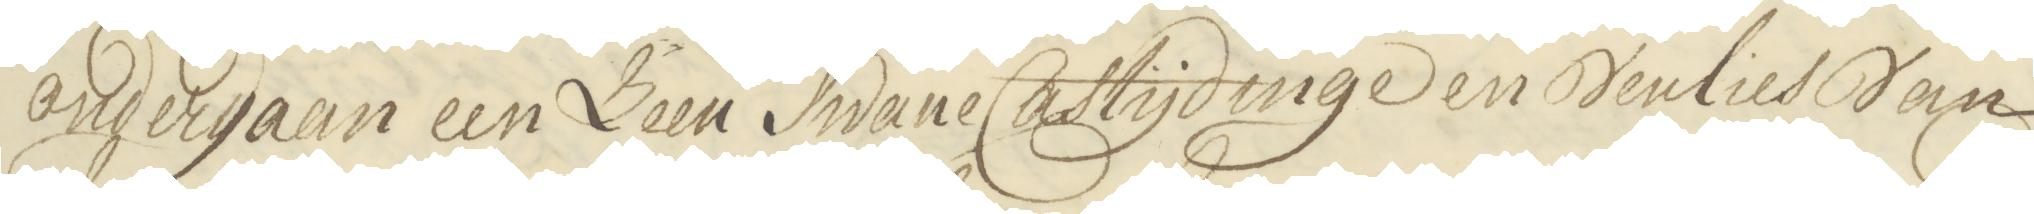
ondergaan een zeer sware Castijdinge en verlies van
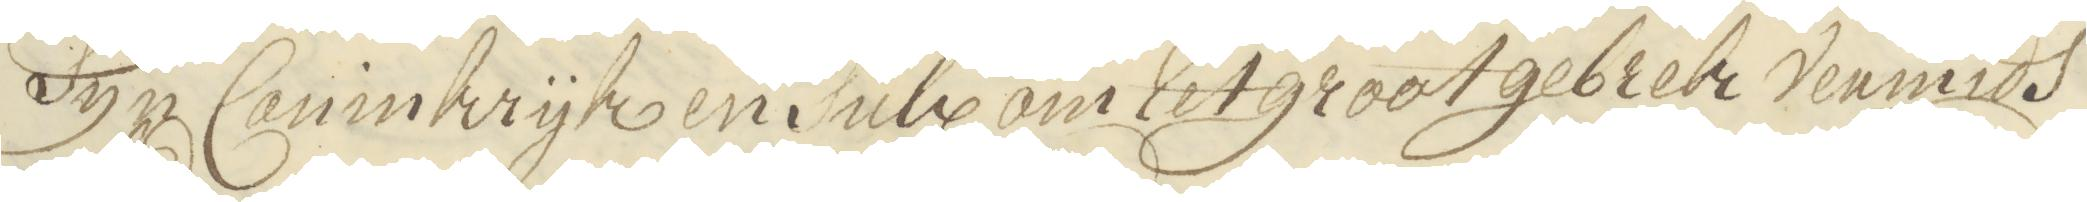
sijn Coninkrijk en sulx om het groot gebrek vermids
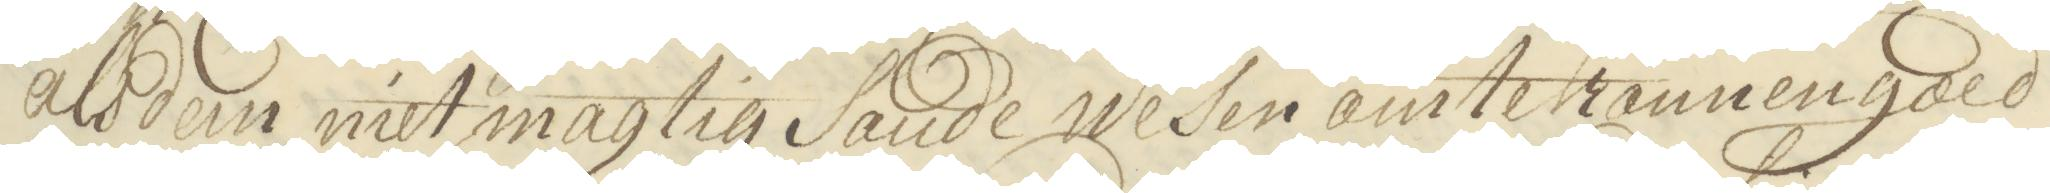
als dan niet magtig soude wesen om te konnen goed
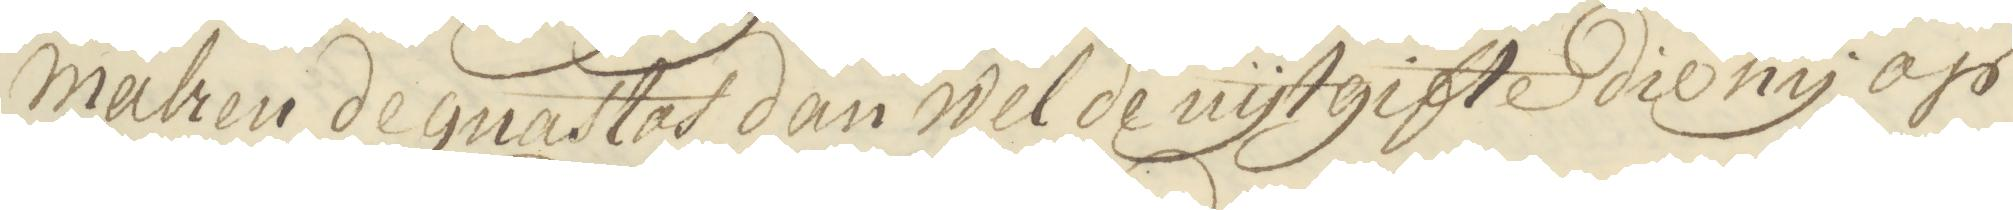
maken de gnastas dan wel de uijtgifte die hij op
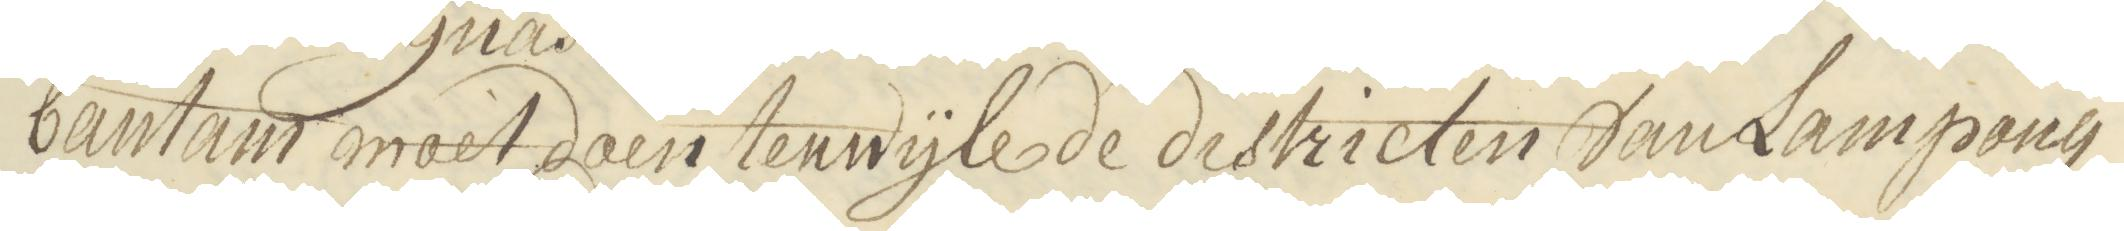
bantam moet doen terwijle de districten van Lampong
